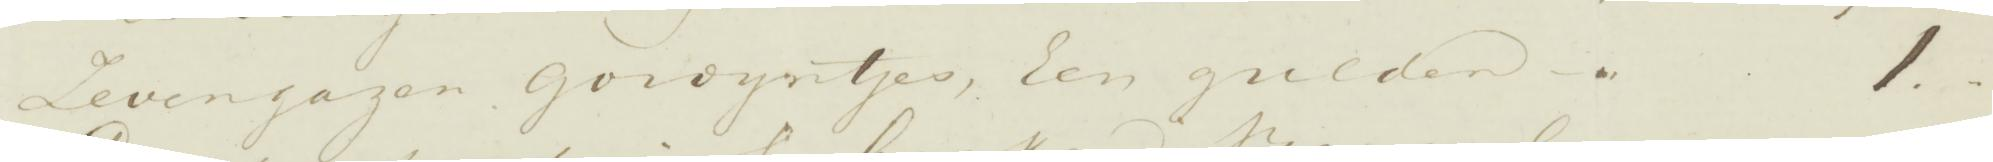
Zevengazen gordyntjes, Een gulden —„ 1. „
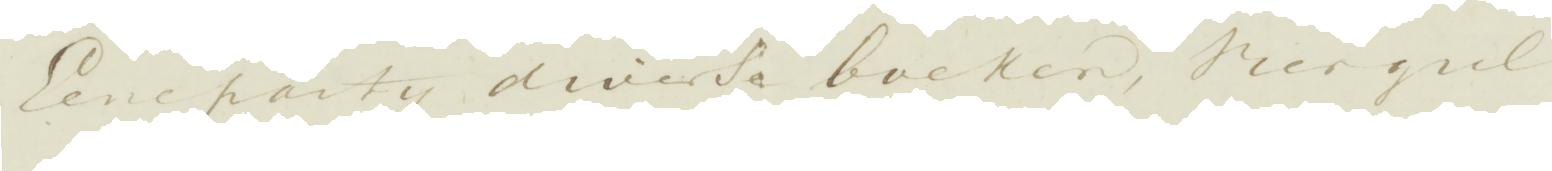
Eene party diverse boeken, Vier gul
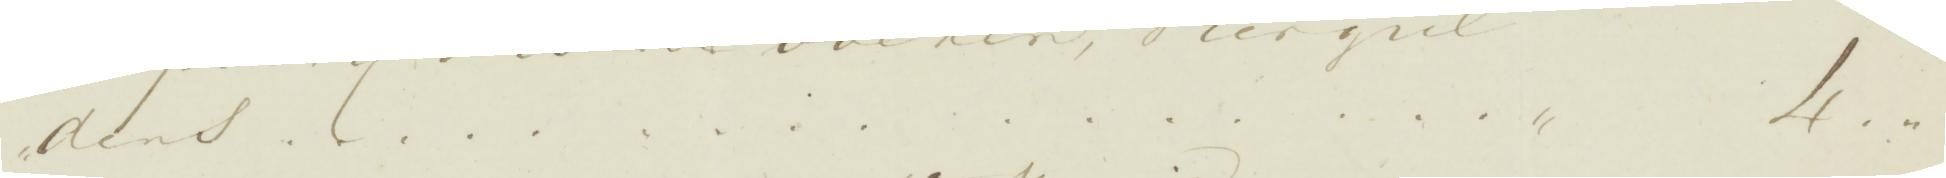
„dens . . . . . . . . . . . . . . . . „ 4. „
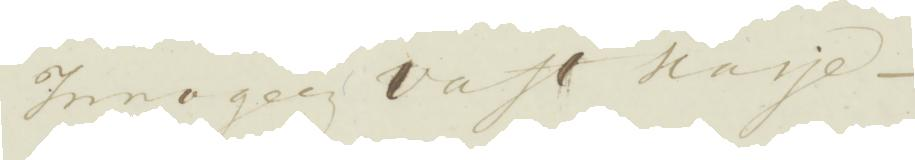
Jnnogeen Vast Kasje -
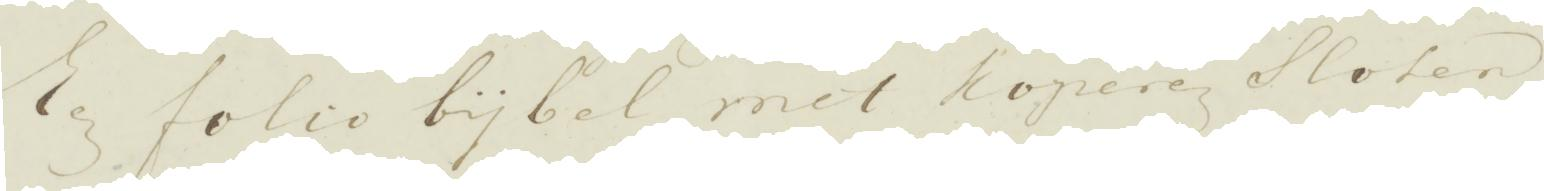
Een folio bijbel met koperen sloten
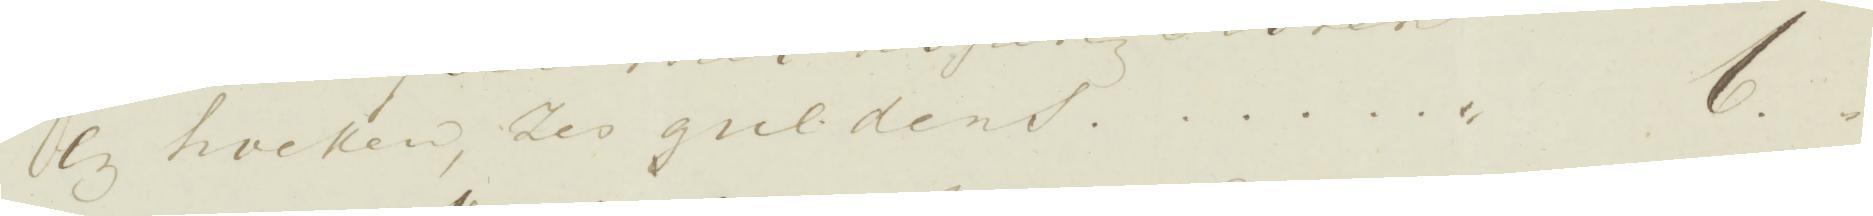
en hoeken, zes guldens. . . . . . „ 6. „
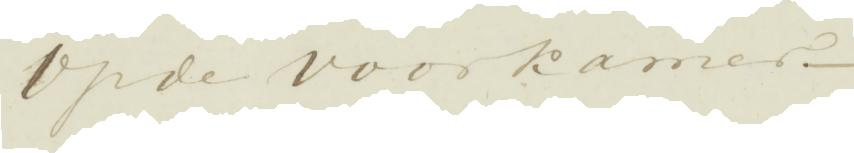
Opde voorkamer—
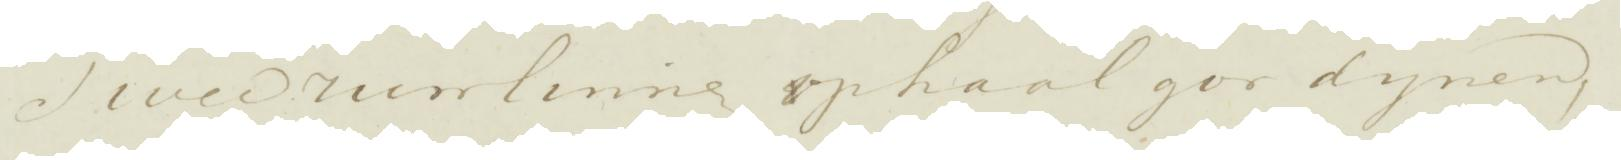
Twee ruwlinnen ophaalgordynen,
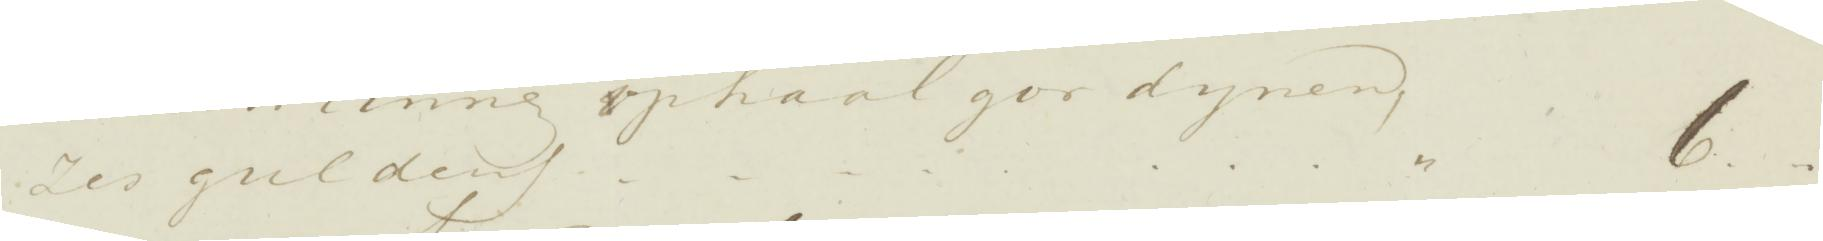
Zes guldens . . . . . . . . „ 6. „
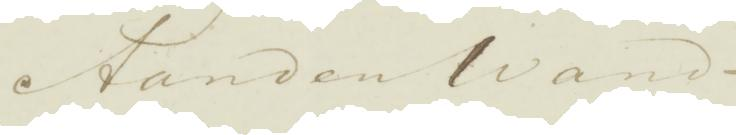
Aanden Wand
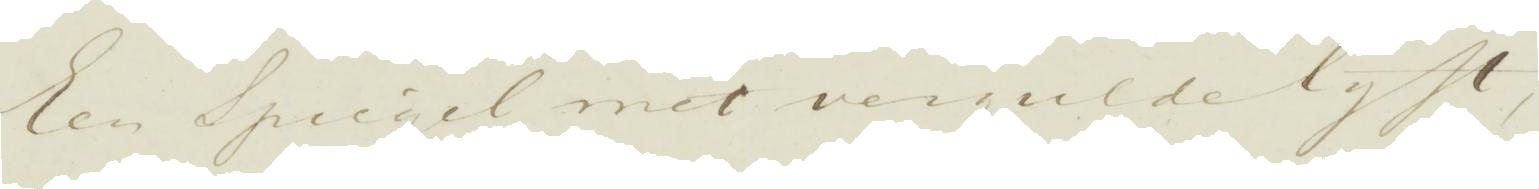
Een spiegel met vergulde lyst,
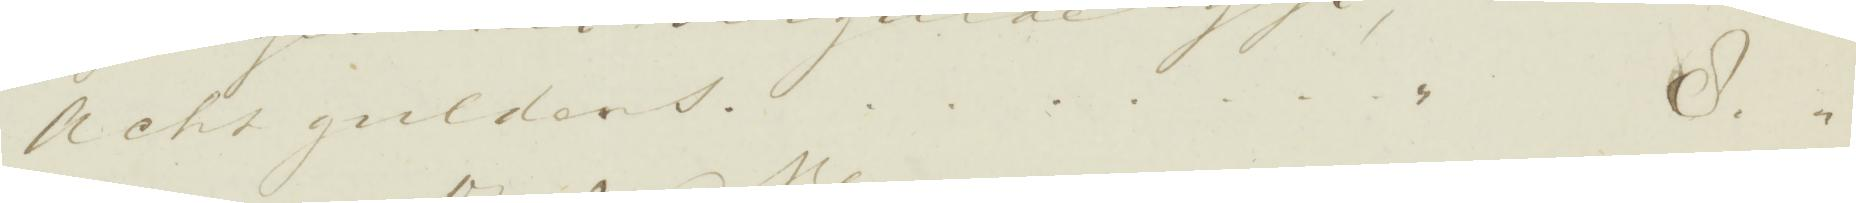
Acht guldens. . . . . . . . „ 8. „
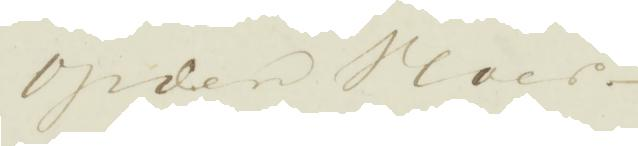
Opden Vloer.
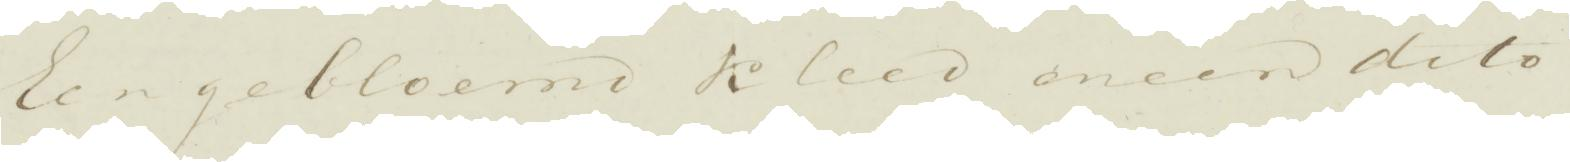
Een gebloemd kleed en een dito
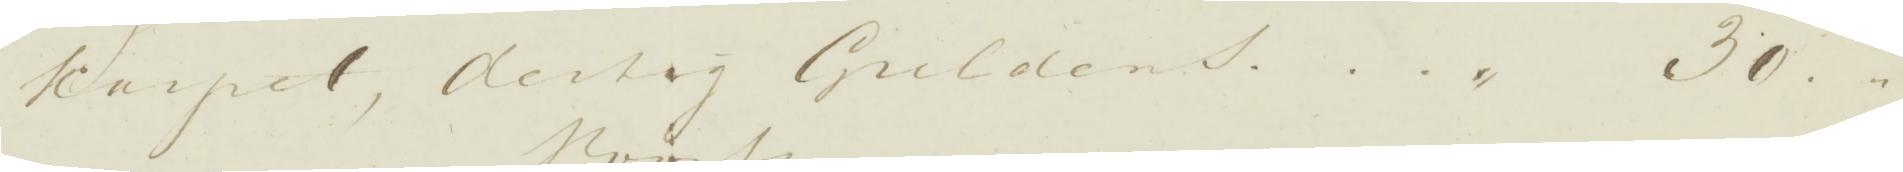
karpet, dertig Guldens. . . „ 30. „
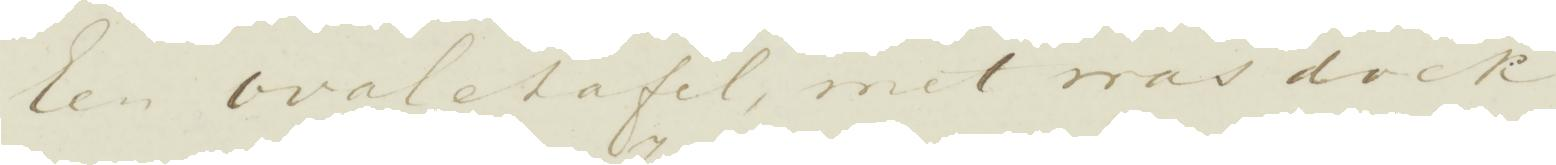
Een ovaletafel, met was doek
